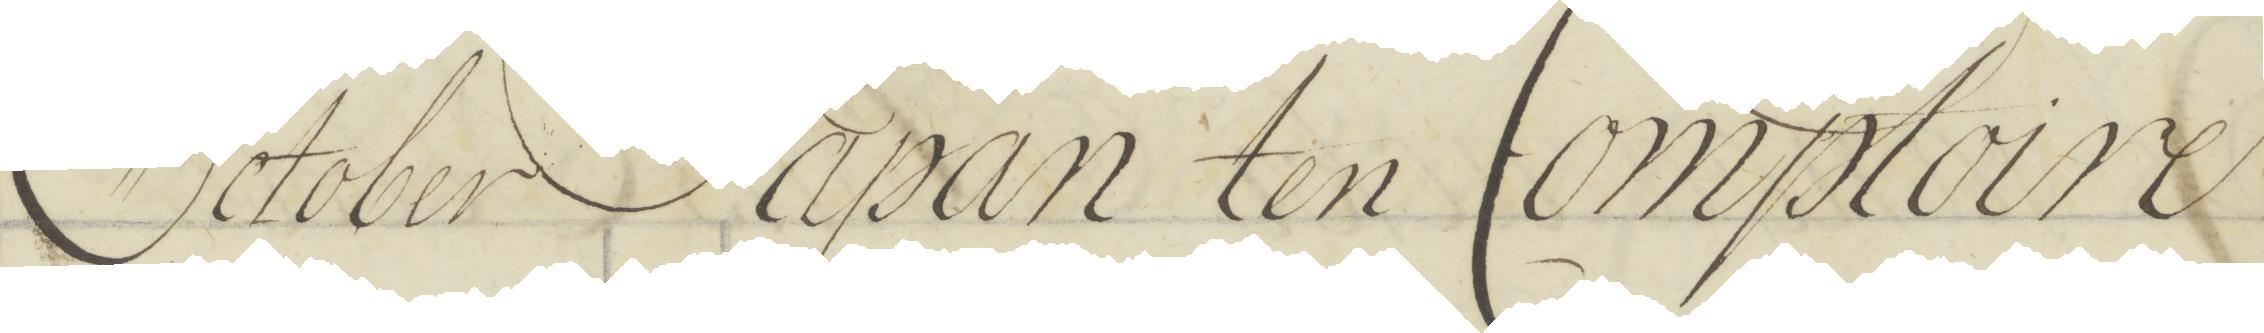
October Iapan ten Comptoire
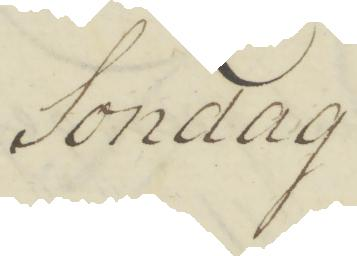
sondag
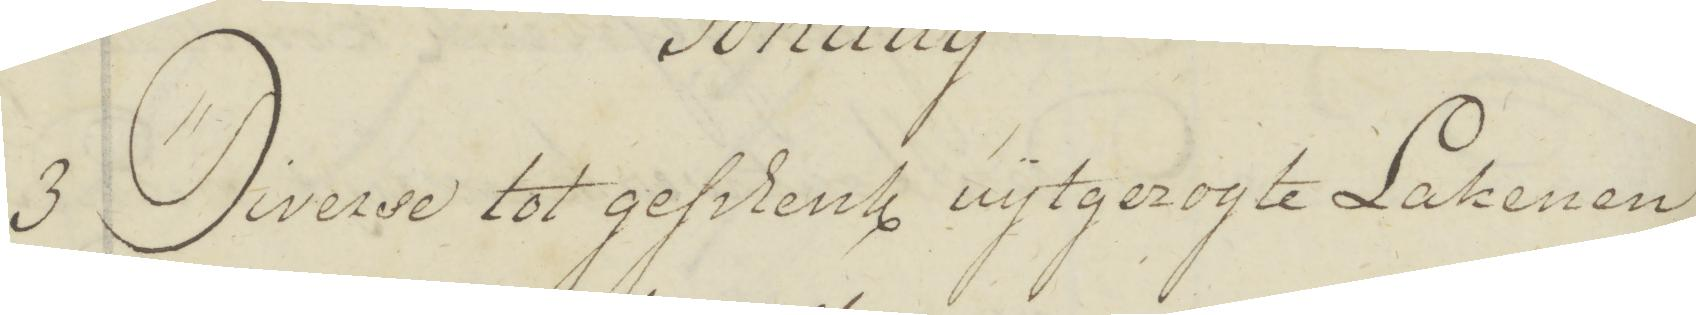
3 Diverse tot geschenk uijtgezogte Lakenen
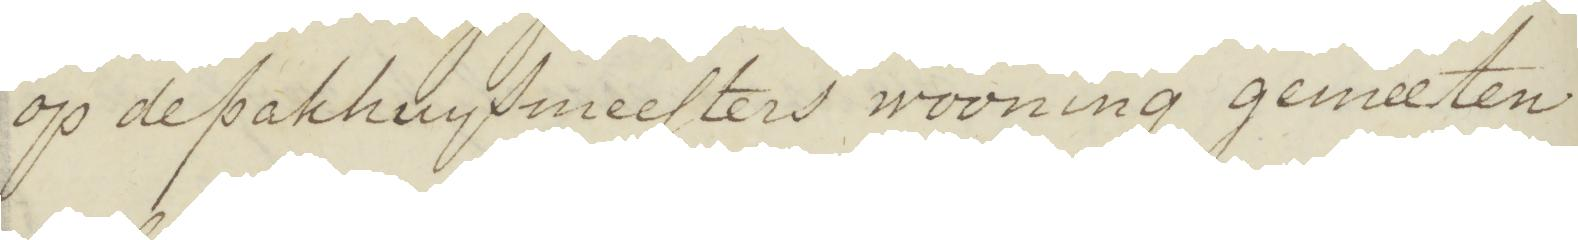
op de pakhuysmeesters wooning gemeeten
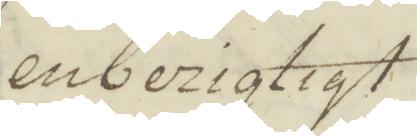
en bezigtigt
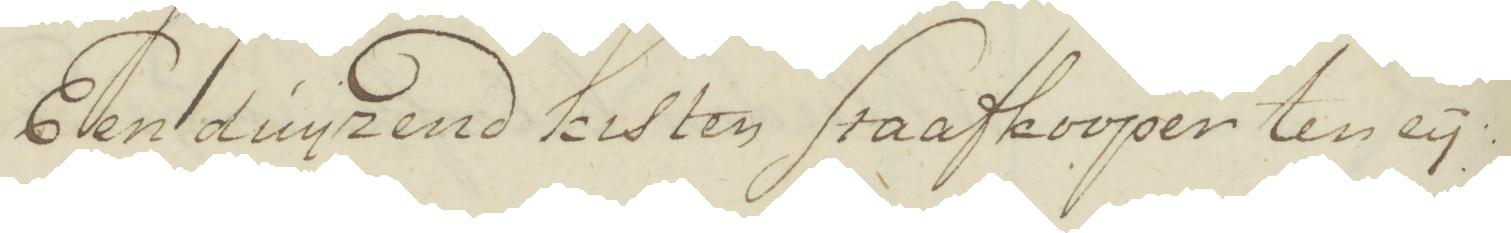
Een duijzend kisten staafkooper ten eij:
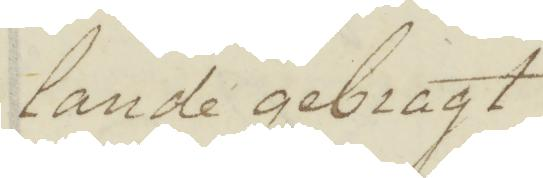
lande gebragt
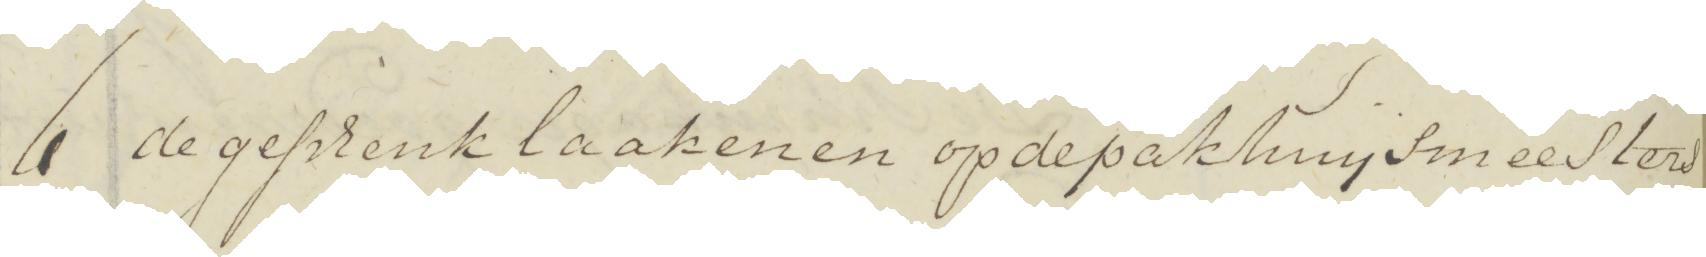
4 de geschenk laakenen op de pakhuijsmeesters
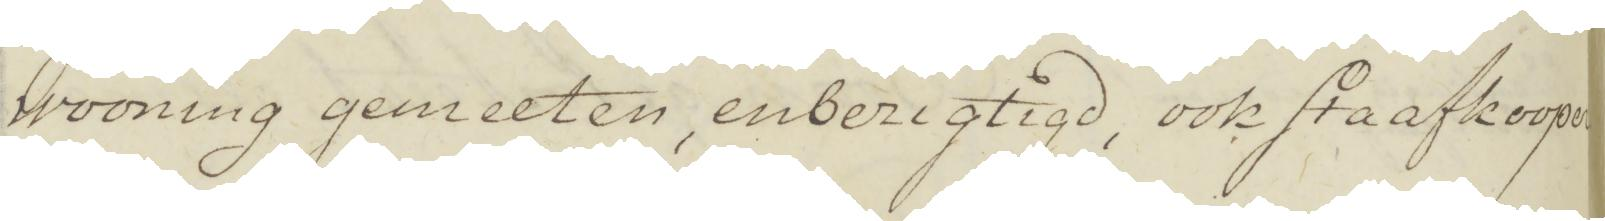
wooning gemeeten, en bezigtigd, ook staafkooper
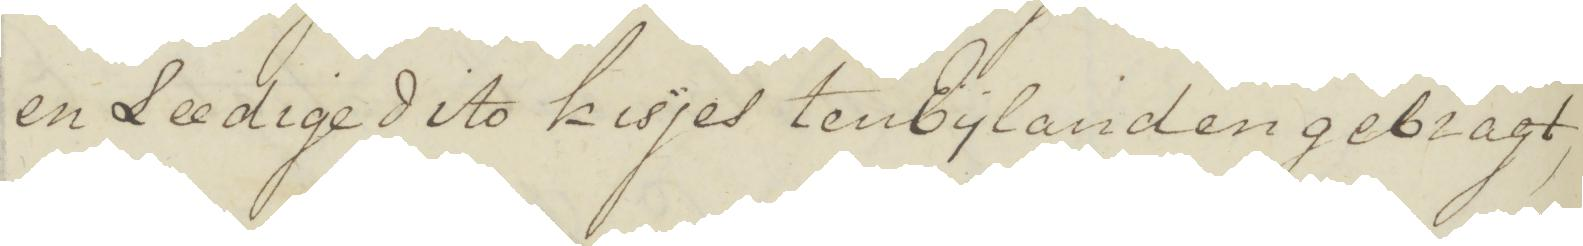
en Leedige dito kisjes ten Eijlanden gebragt,
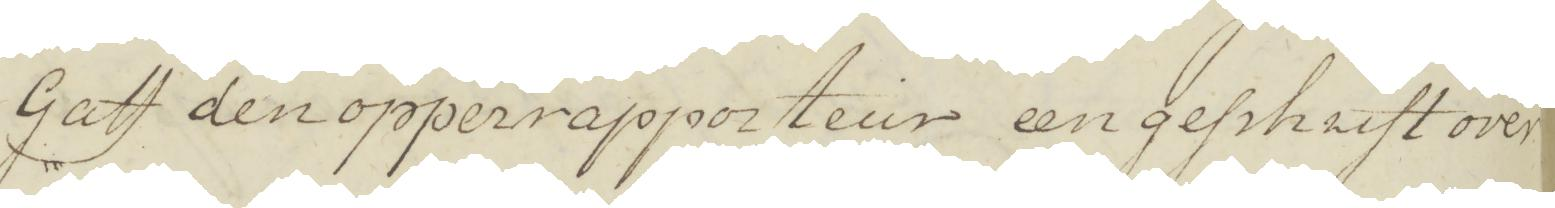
Gaff den opperrapporteur een geschrift over
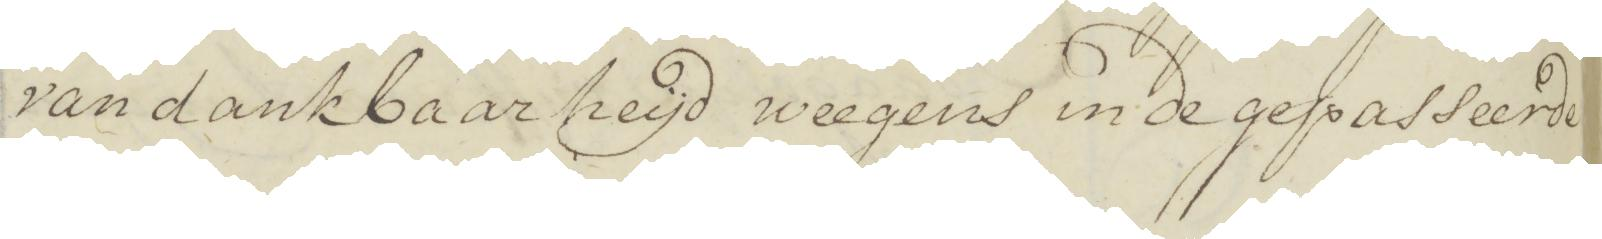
van dankbaarheijd weegens in de gepasseerde
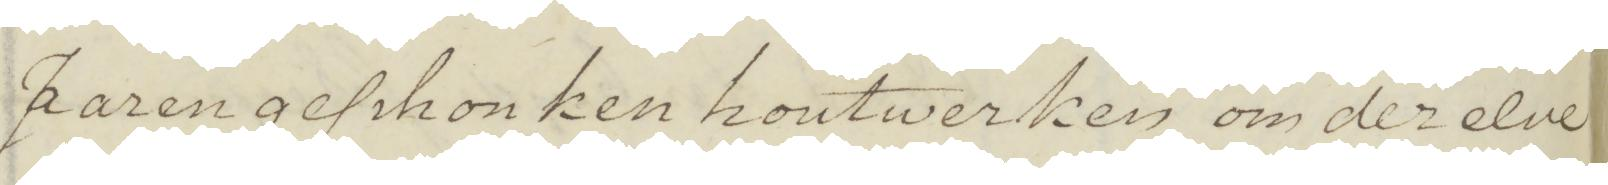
Jaaren geschonken houtwerken, om dezelve
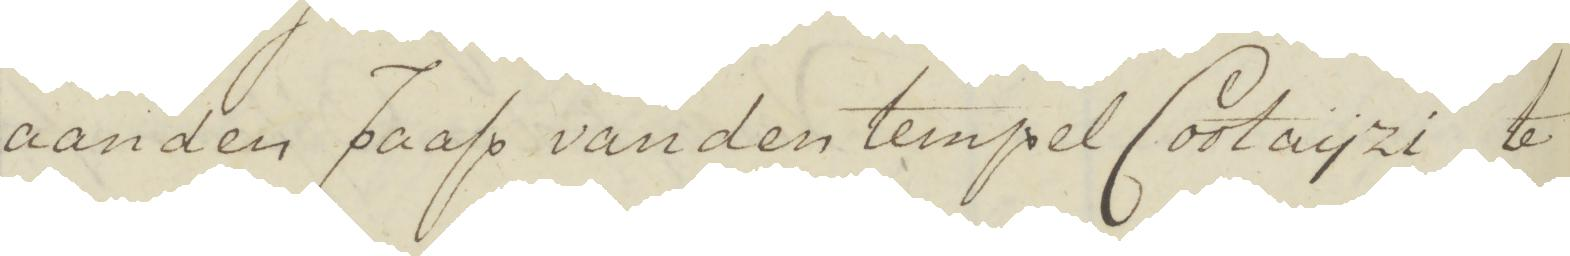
aan den paap van den tempel Cootaijzi te
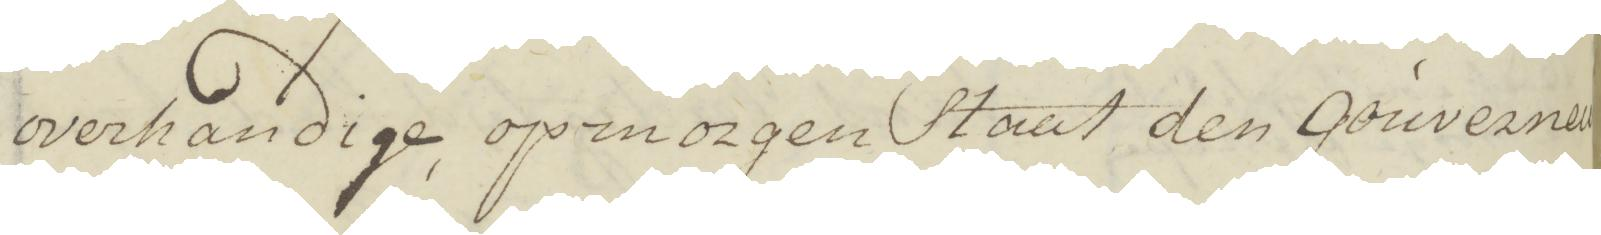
overhandige, op morgen staat den Gouverneu
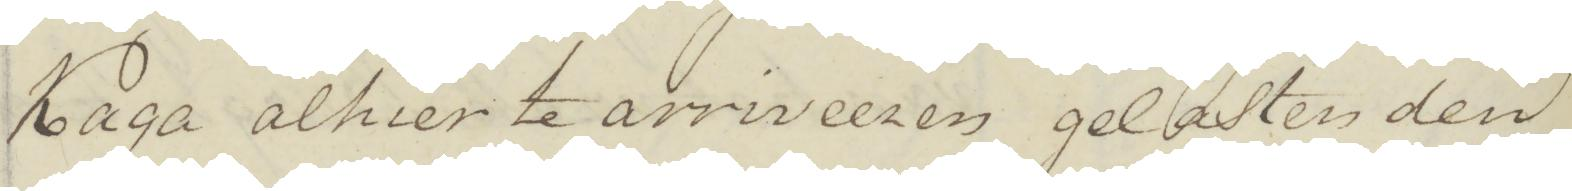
Kaga alhier te arriveeren, gelasten den
